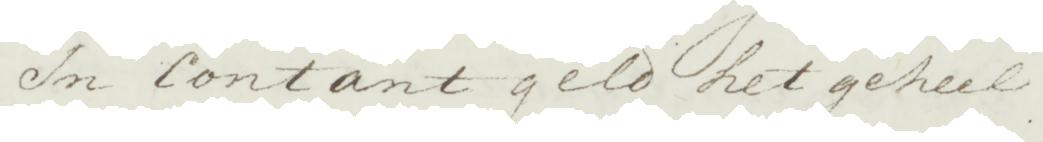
In Contant geld het geheel
